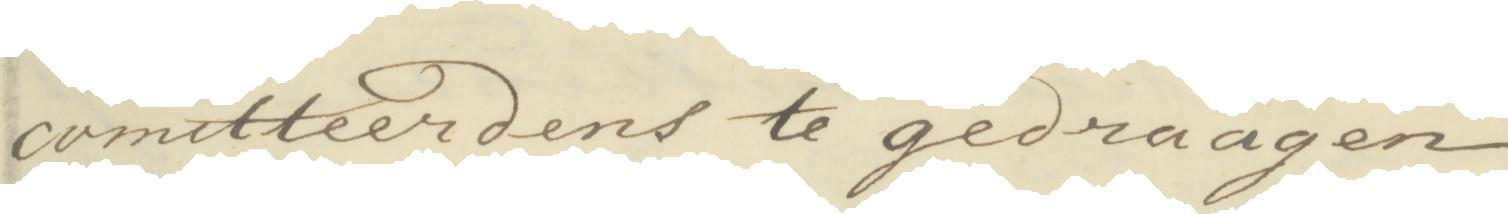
comitteerdens te gedraagen
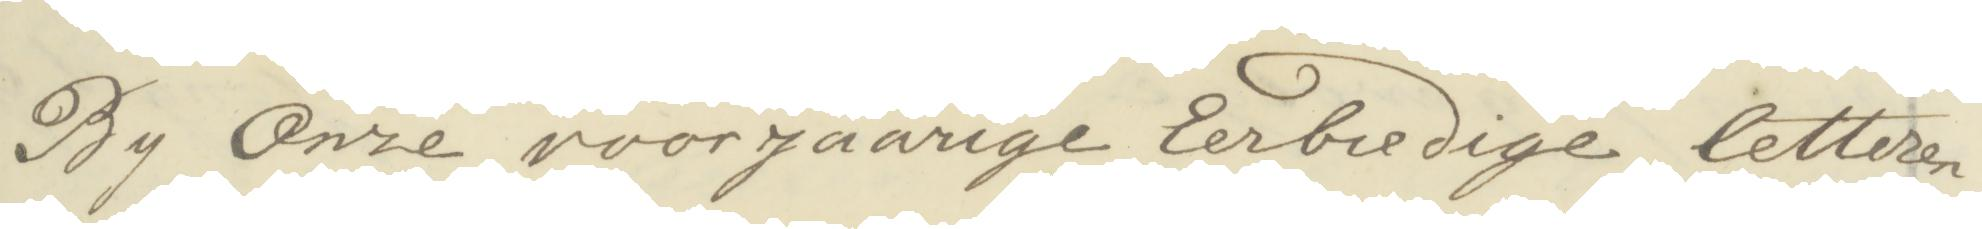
By Onze voorjaarige Eerbiedige letteren
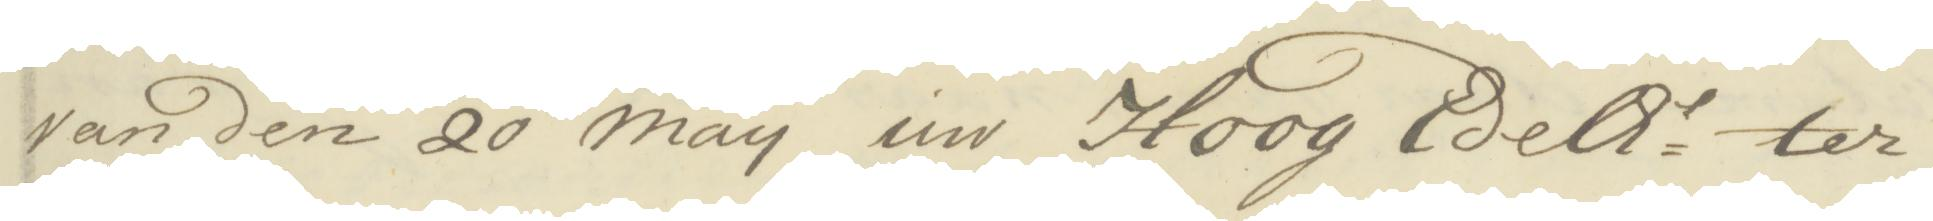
van den 20 maij uw Hoog Edelh:s ter
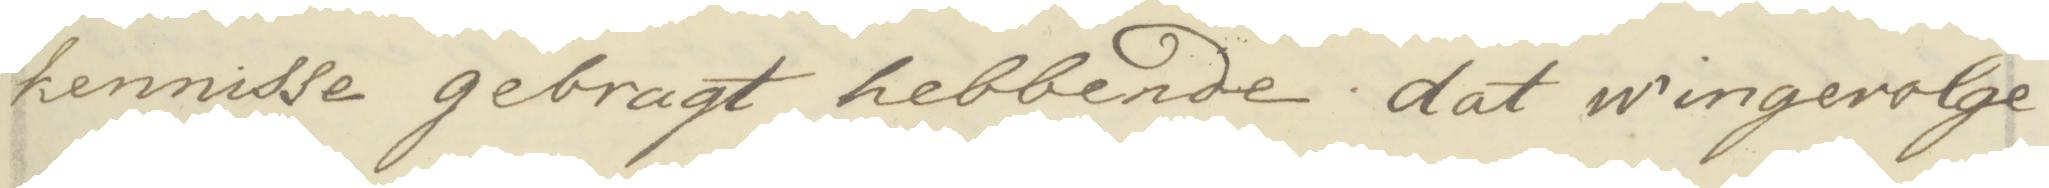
kennisse gebragt hebbende dat w'ingevolge
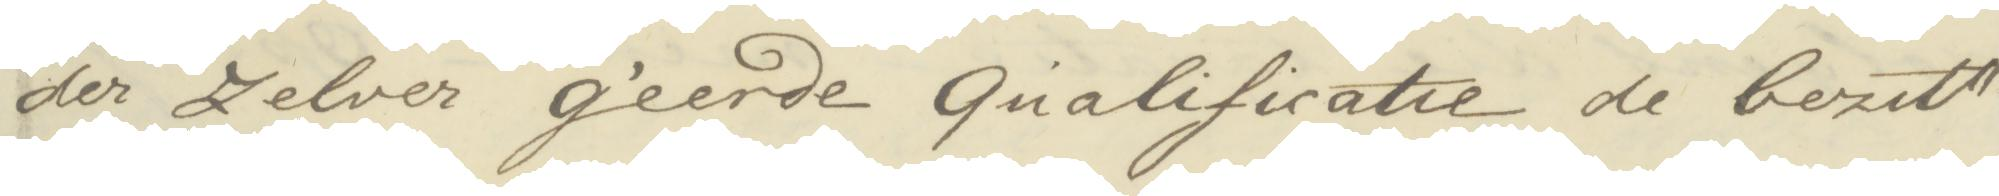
der zelver g'eerde qualificatie de bezit
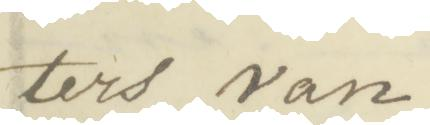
ters van
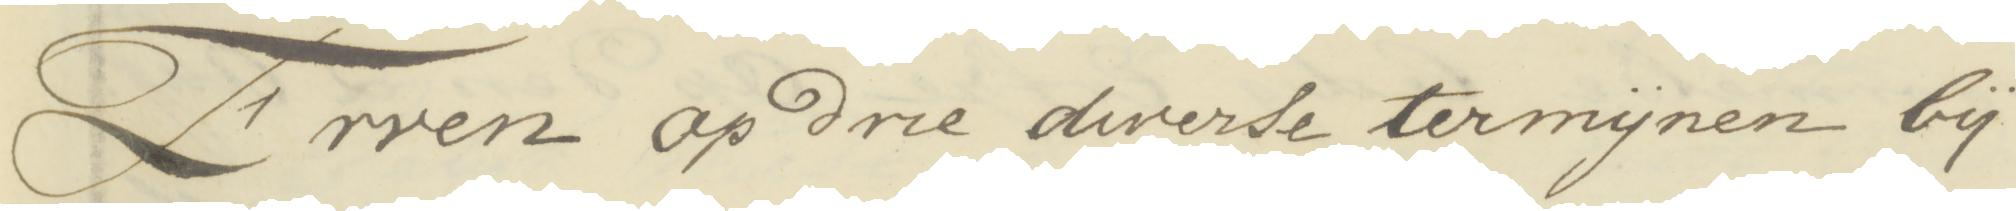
Erven op drie diverse termijnen bij
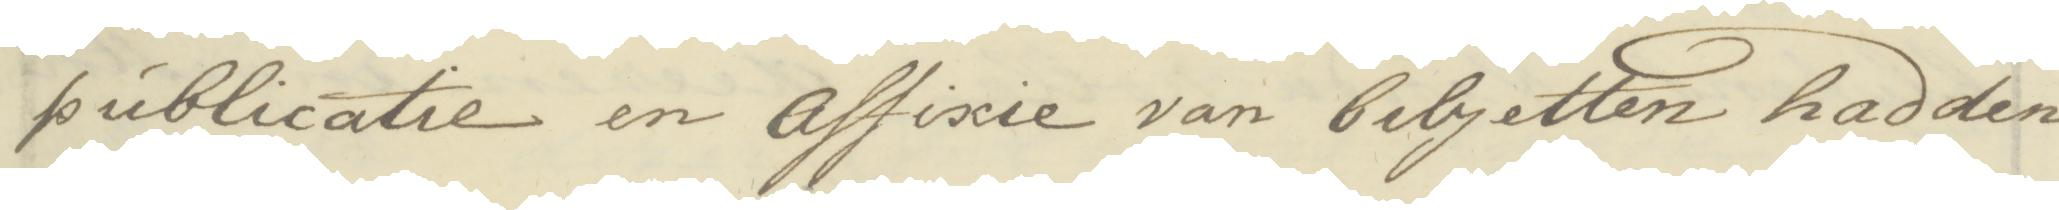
publicatie en affixie van bilyetten hadden
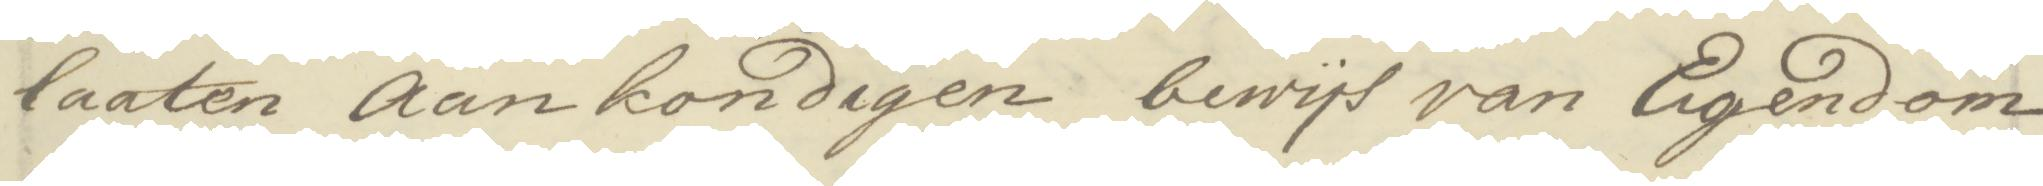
laaten aan kondigen bewijs van Eigendom
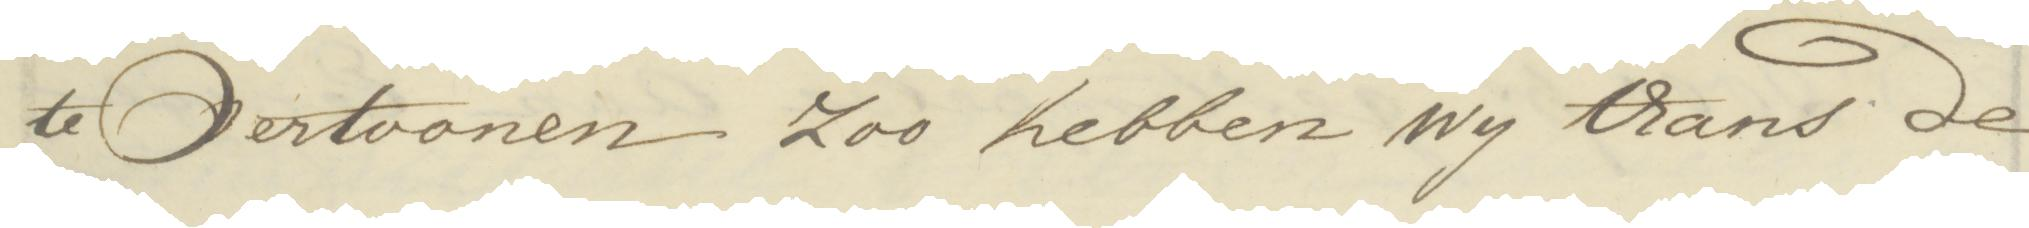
te Vertoonen zoo hebben wy thans de
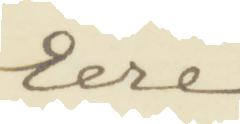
Eere
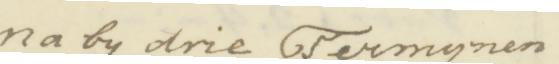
na by drie Termynen
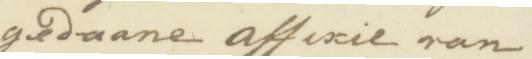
gedaane affixie van
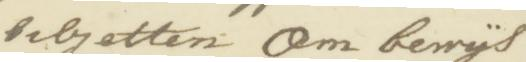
bilyetten om bewijs
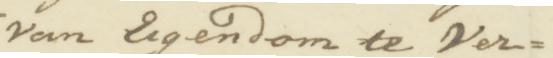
van Eigendom te Ver=
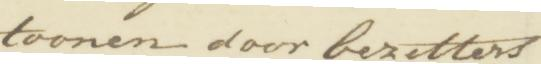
toonen door bezitters
